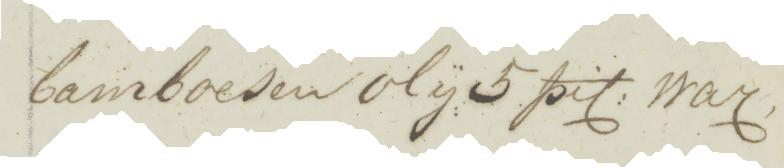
bamboesen olij 5 pic: wax
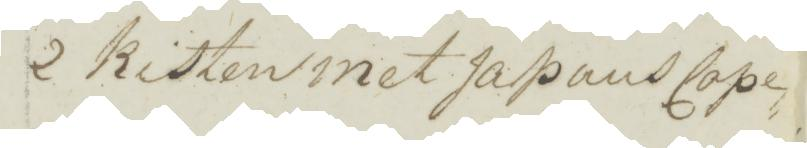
2 kisten met japans Cope„
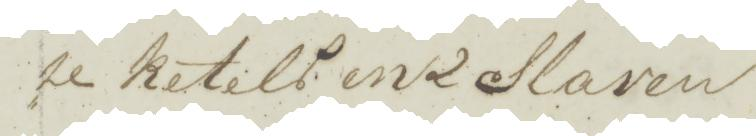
„re ketels en 2 slaven
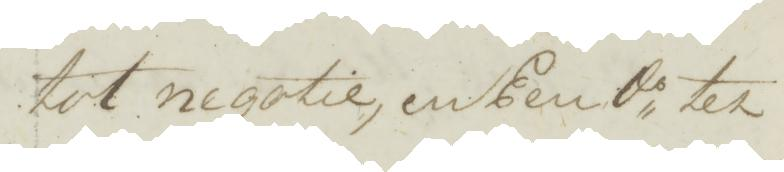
tot negotie, en Een d„o ter
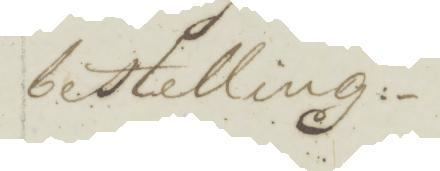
bestelling: -
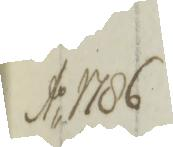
A„o 1786
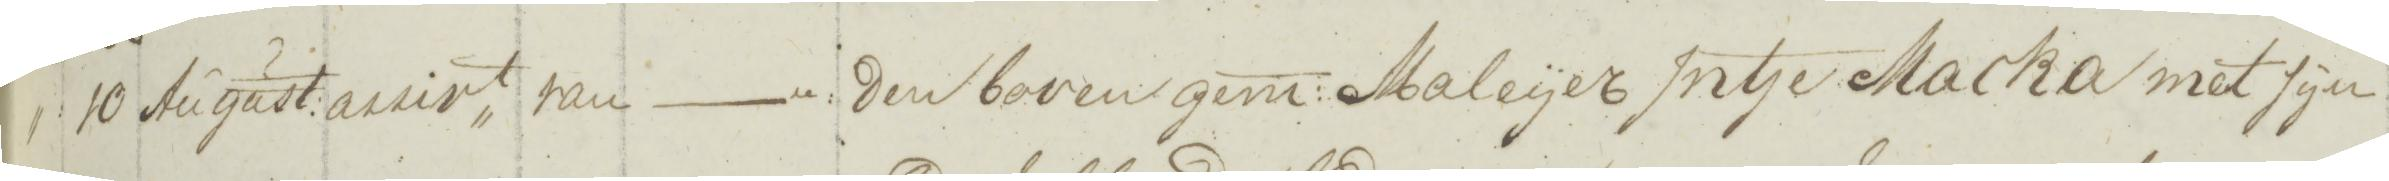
„ : 10 August: arriv„t van —o: den boven gem: Maleijer Jntje Macka met sijn
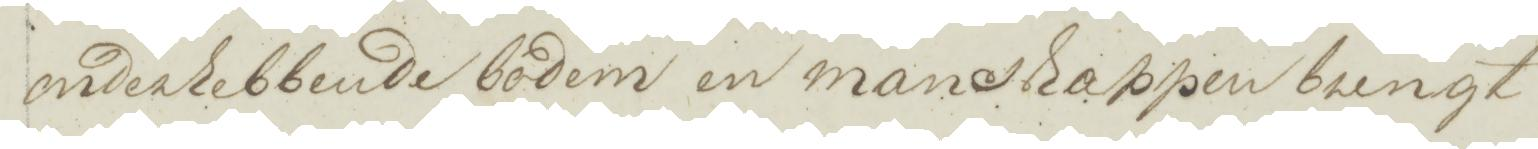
onderhebbende bodem en manschappen brengt
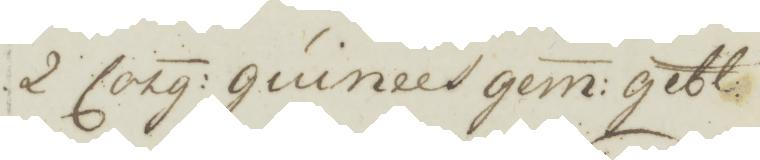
2 Corg: guinees gem: gebl:
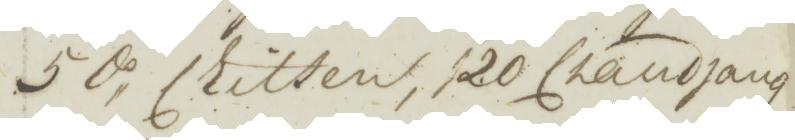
5 d„o Chitsen, 120 Chandjang
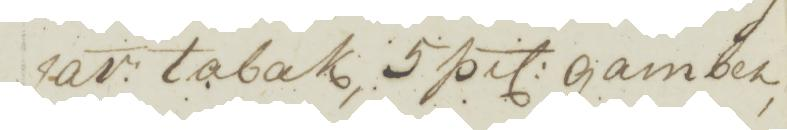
jav: tabak, 5 pic: gamber,
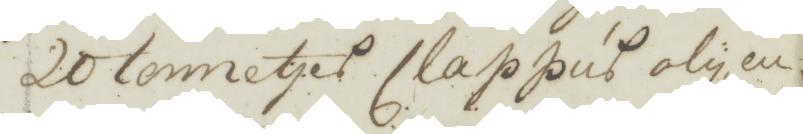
20 tonnetjes Clappus olij en
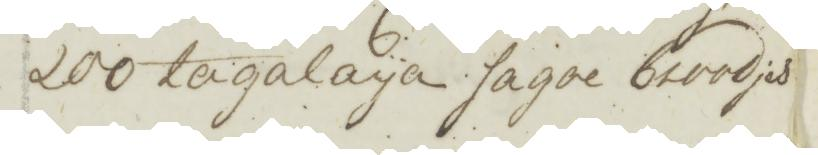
200 tagalaija sagoe broodjes
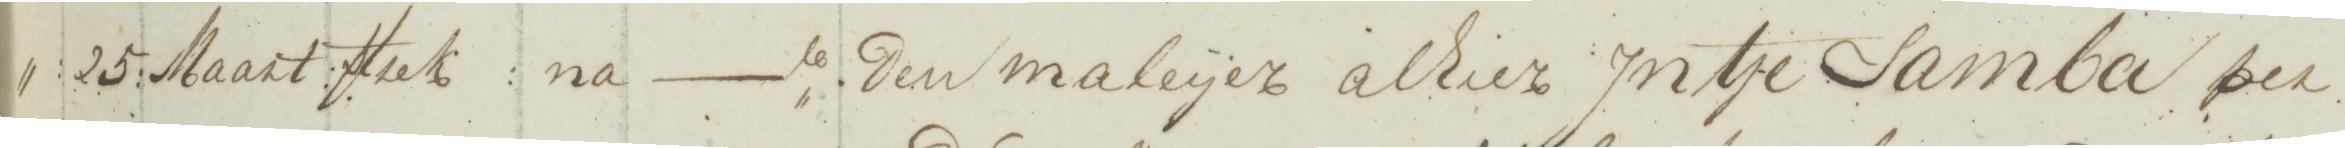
„ : 25: Maart : vertrek : na _„o . den maleijer alhier Jntje Samba per
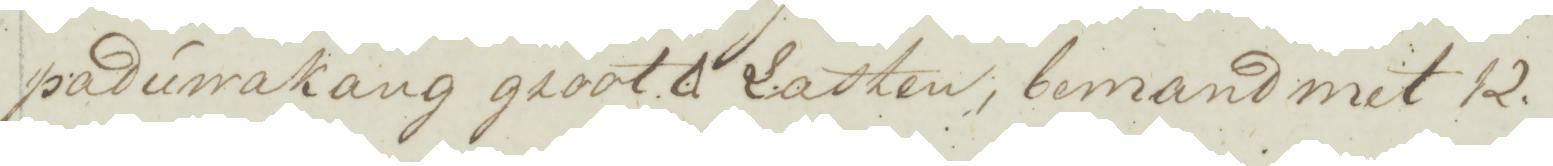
paduwakang groot 4 Lasten, bemand met 12.
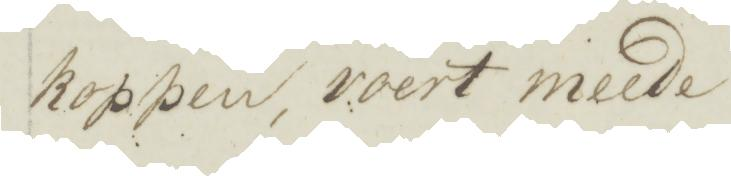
koppen, voert meede
